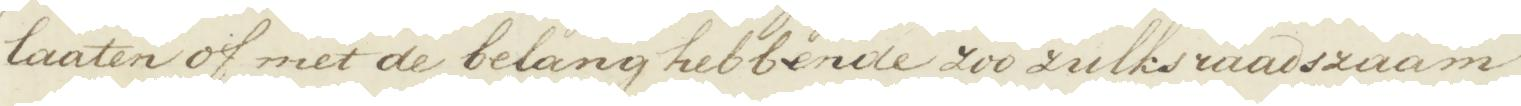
laaten of met de belang hebbende zoo zulks raadszaam
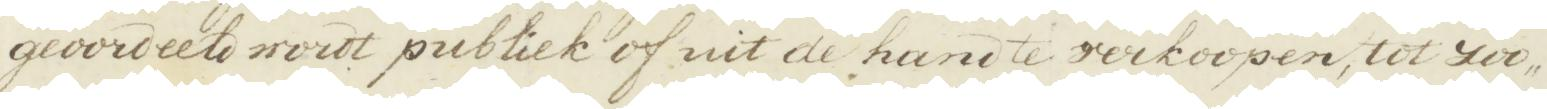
geoordeeld wordt publiek of uit de hand te verkoopen, tot zoo„
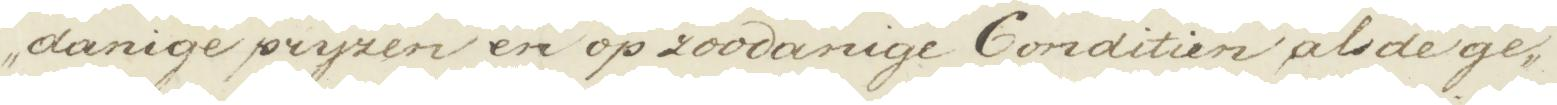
„danige pryzen en op zoodanige Conditien, als de ge„
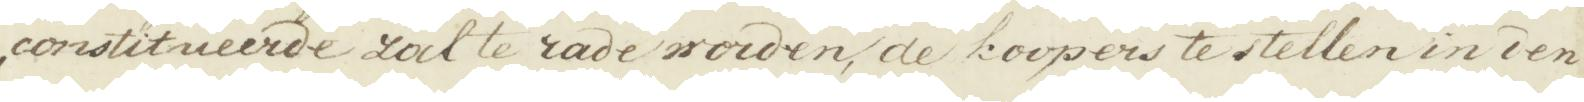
constitueerde zal te rade worden, de koopers te stellen in den
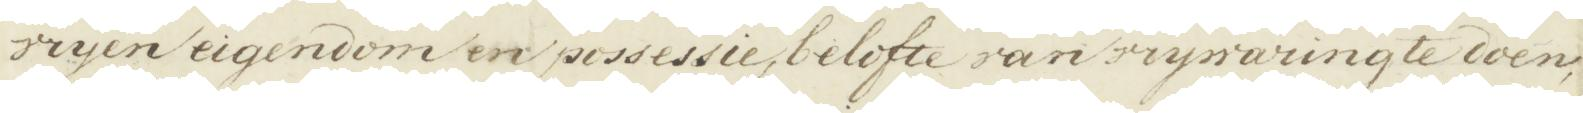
vryen eigendom en possessie, belofte van vrywaring te doen,
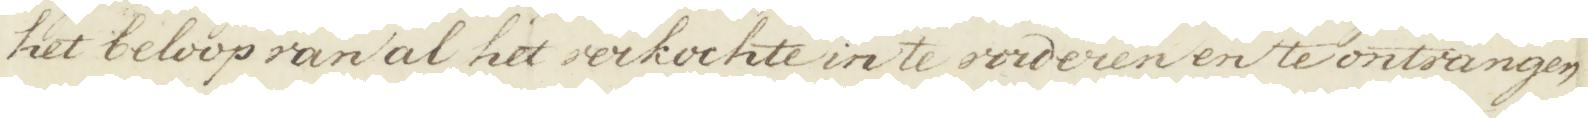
het beloop van al het verkochte in te vorderen en te ontvangen
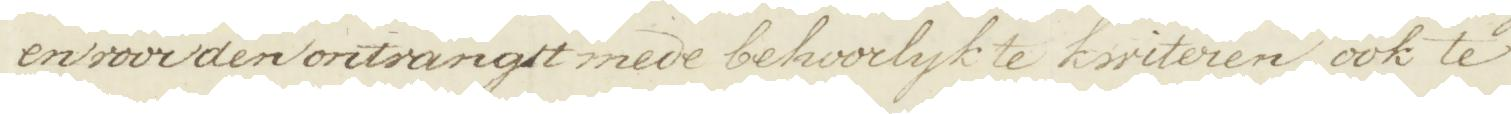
en voor den ontvangst mede behoorlyk te kwiteren, ook te
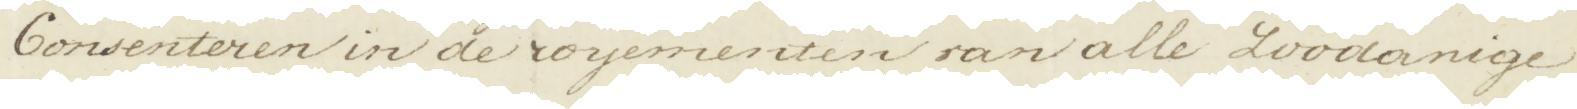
Consenteren in de royementen van alle zoodanige
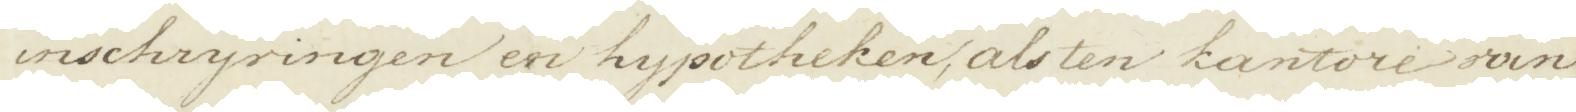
inschryvingen en hypotheken, als ten kantore van
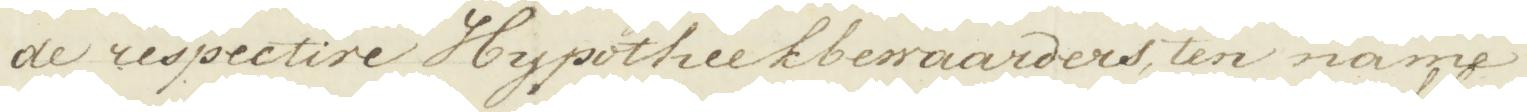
de respective Hypotheekbewaarders, ten name
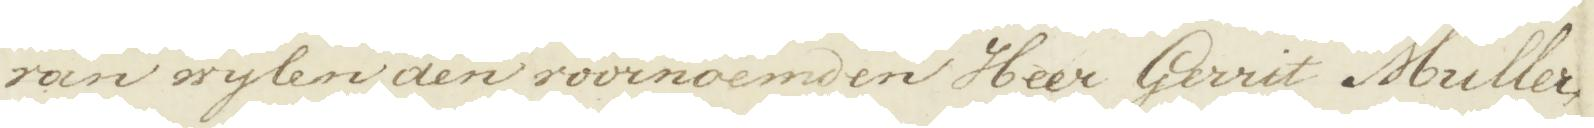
van wylen den voornoemden Heer Gerrit Muller,
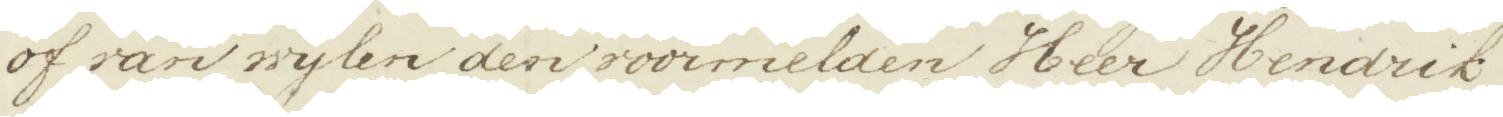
of van wylen den voormelden Heer Hendrik
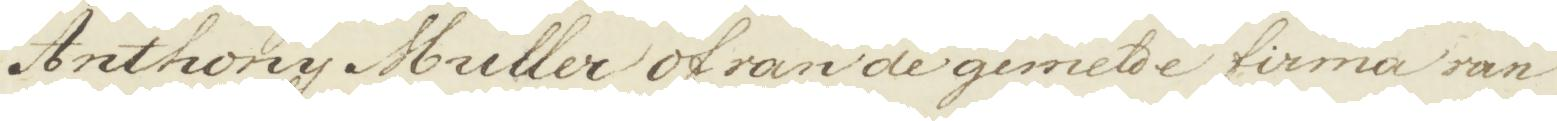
Anthony Muller of van de gemelde firma van
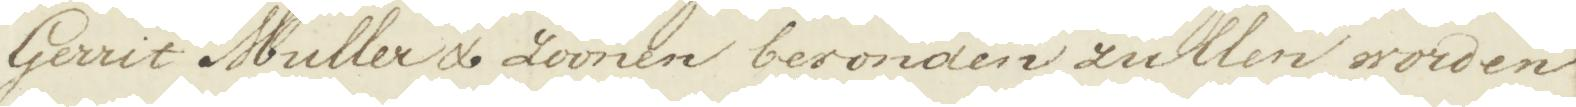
Gerrit Muller & zoonen bevonden zullen worden
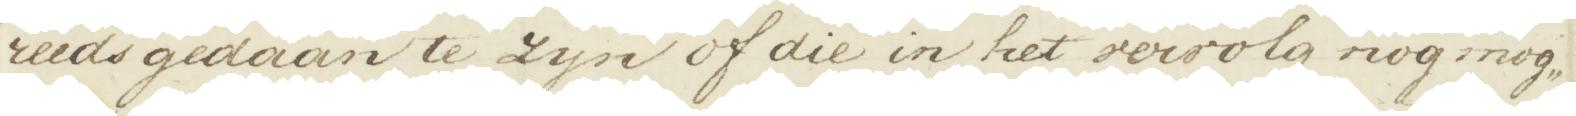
reeds gedaan te zyn of die in het vervolg nog mog„
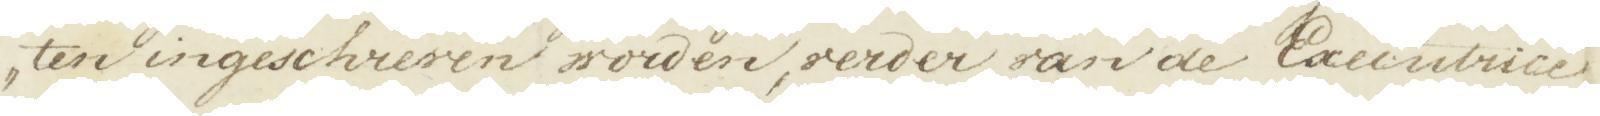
„ten ingeschreven worden, verder van de Executrice
